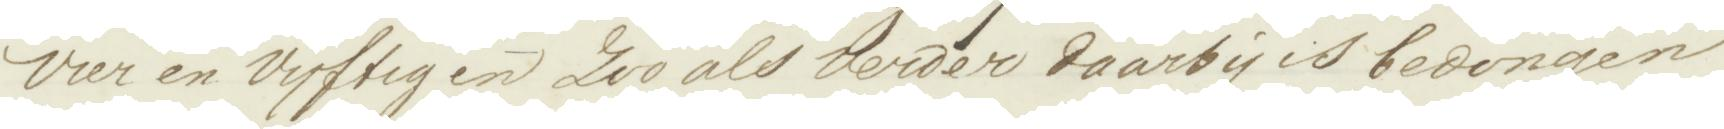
vier en vyftig en zoo als verder daarbij is bedongen
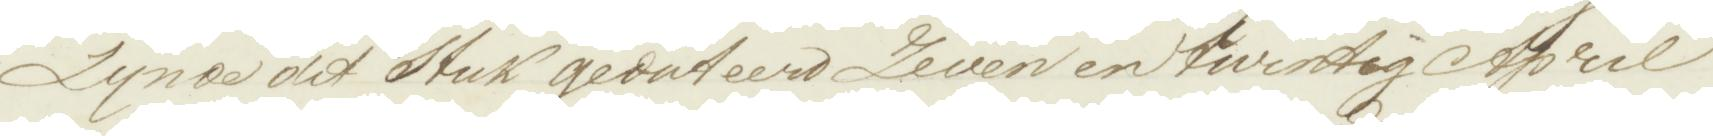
Zynde dit stuk gedateerd Zeven en twintig April
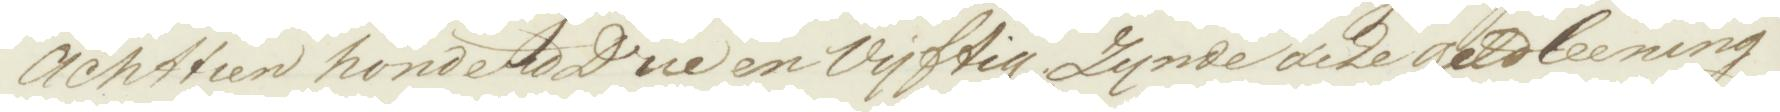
Achttien honderd Drie en vijftig, zynde deze geldleening
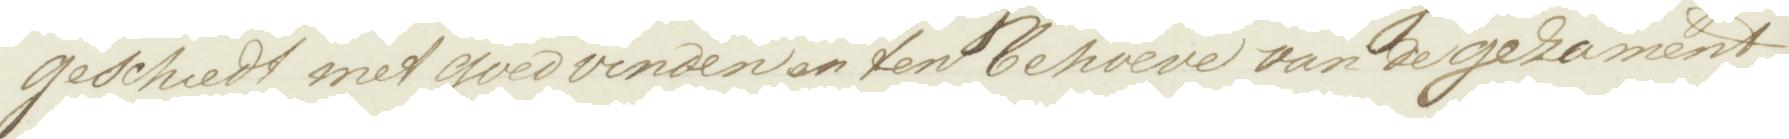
geschiedt met goedvinden en ten behoeve van de gezament
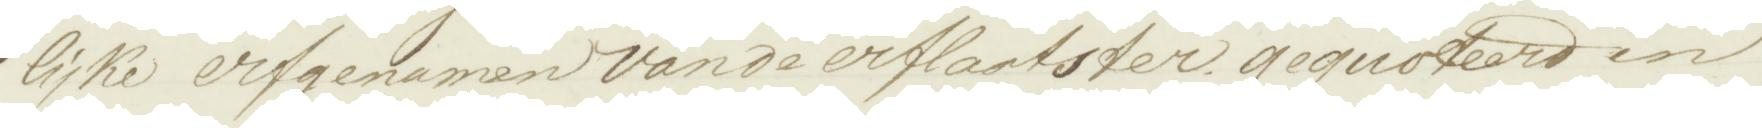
lijke Erfgenamen van de erflaatster gequoteerd en
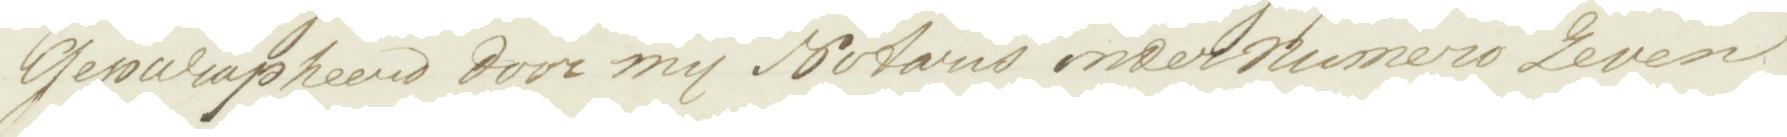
Geparapheerd door mij Notaris onder Numero Zeven
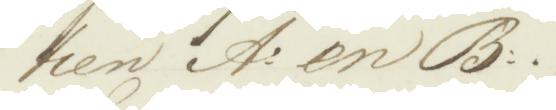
tien A: en B:.
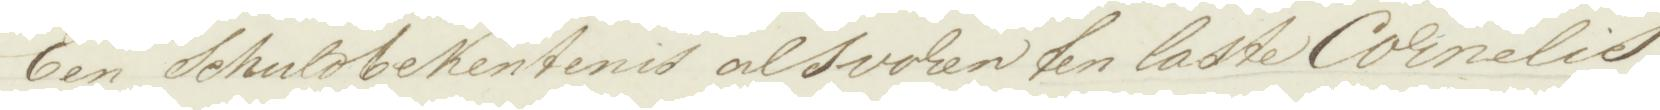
Een schuld bekentenis alsvoren ten laste Cornelis
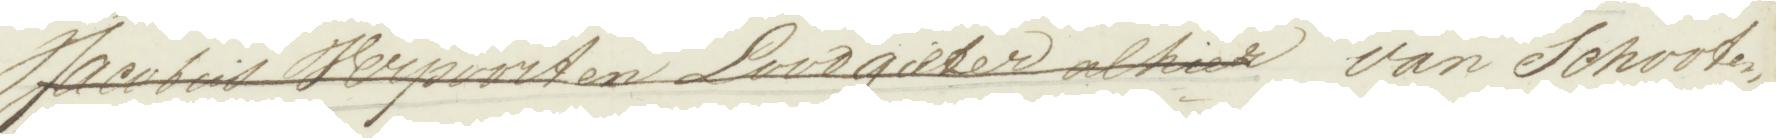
Jacobus Verpoorten Loodgieter alhier van Schooten
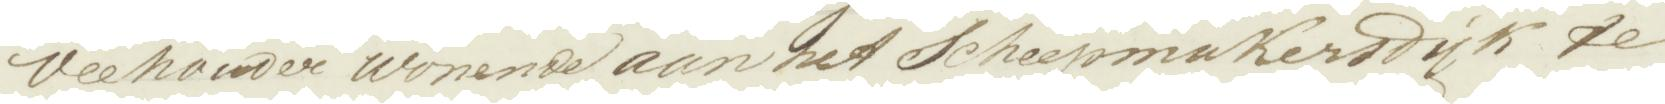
veehouder wonende aan het scheepmakersdijk te
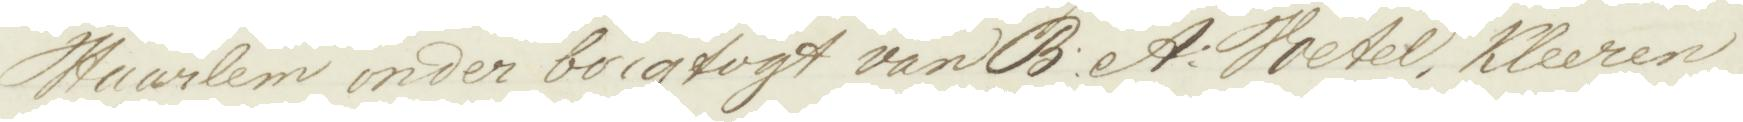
Haarlem onder borgtogt van B: A: Voetel, Kleeren
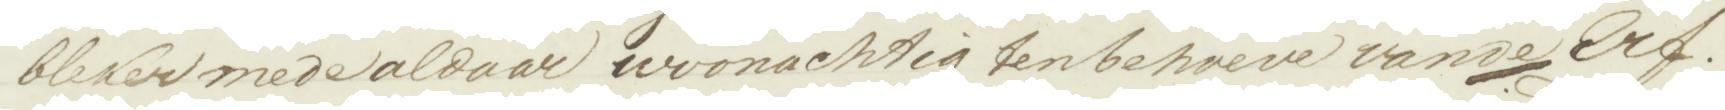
bleker mede aldaar woonachtig ten behoeve vande Erf.
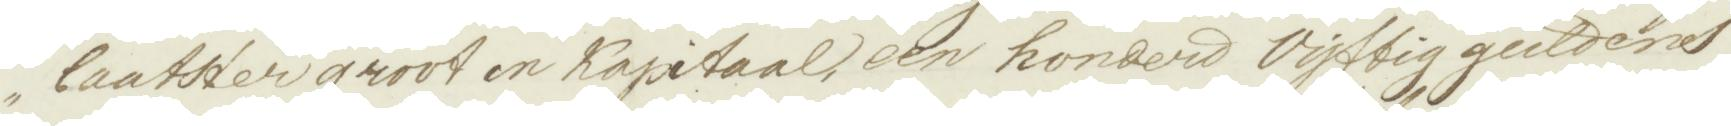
„laatster groot en Kapitaal, een honderd Vijftig guldens
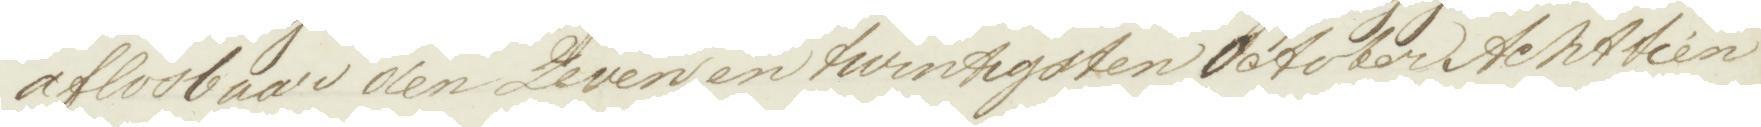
aflosbaar den Zeven en twintigsten October Achttien
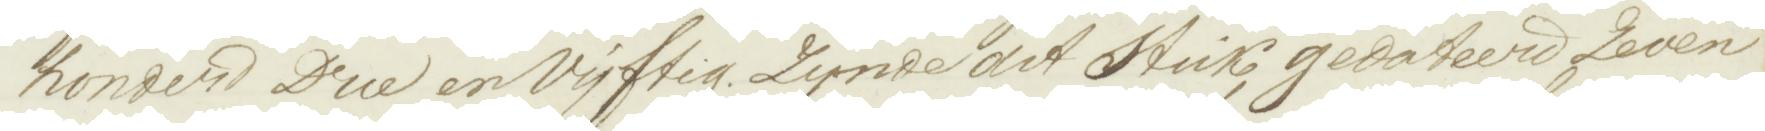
honderd Drie en vijftig zynde dit Stuk, gedateerd Zeven
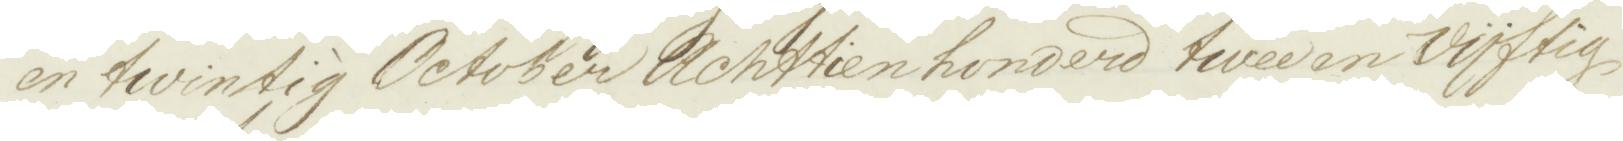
en twintig October Achttien honderd twee en vijftig
